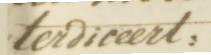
terdiceert:
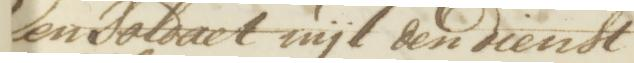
Een soldaet uijt den dienst
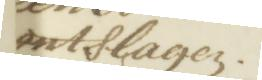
ontslagen.
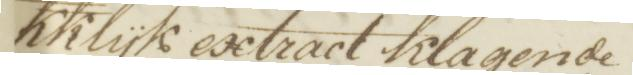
kklijk extract klagende
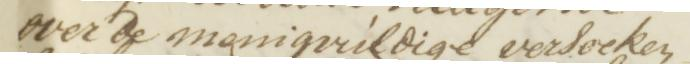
over de menigvuldige versoeken
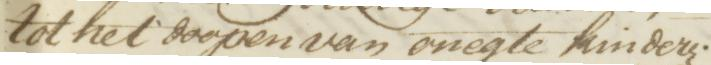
tot het doopen van onegte kinderen.
